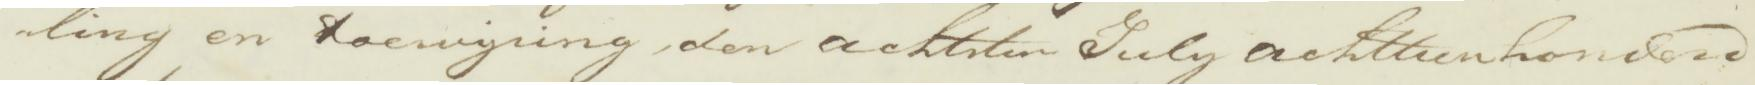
„ling en toewijzing, den achtsten Iuly achttienhonderd
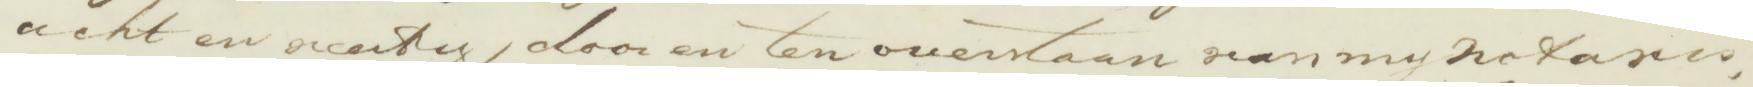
acht en veertig, door en ten overstaan van my notaris,
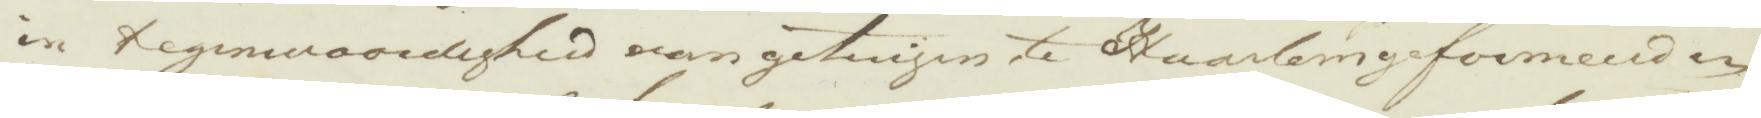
in tegenwoordigheid van getuigen te Haarlem geformeerd en
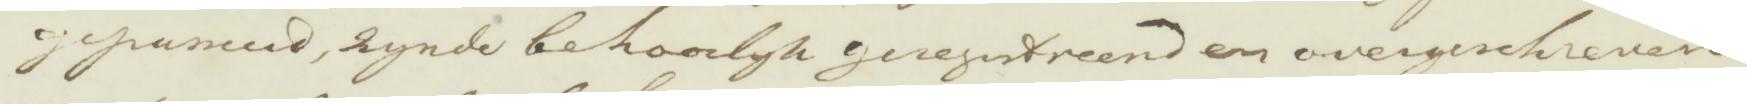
gepasseerd, zynde behoorlyk geregistreerd en overgeschreven
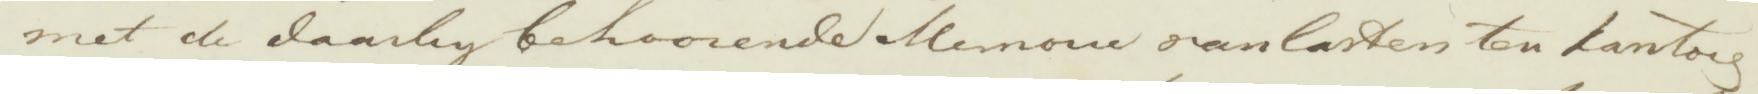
met de daarby behoorende Memorie van lasten ten kantoren
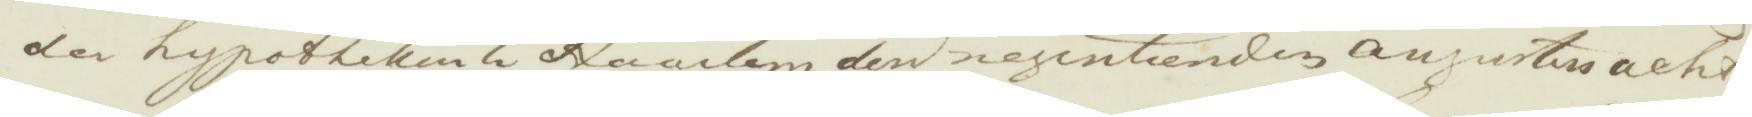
der hypotheken te Haarlem den negentienden augustus acht
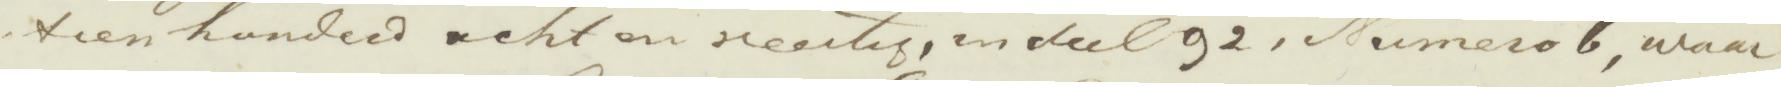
tien honderd acht en veertig, in deel 92, Numero 6, waar
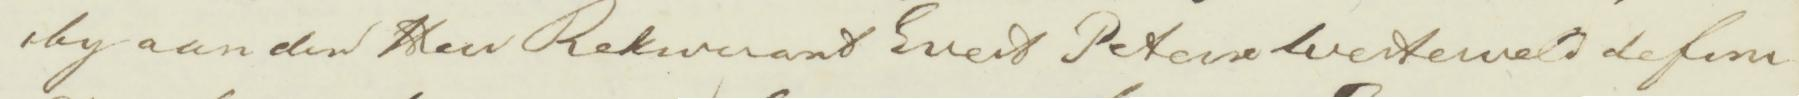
„by aan den Heer Rekwirant Evert Peterse Westerveld defini
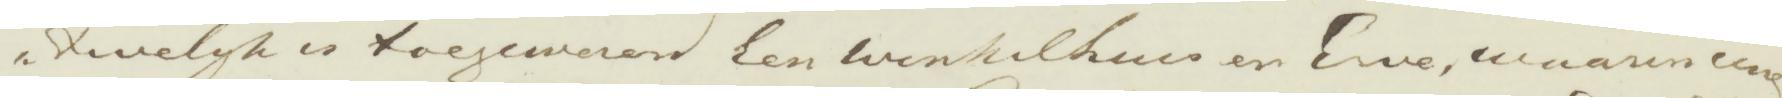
„tivelyk is toegewezen Een winkelhuis en Erve, waarin een
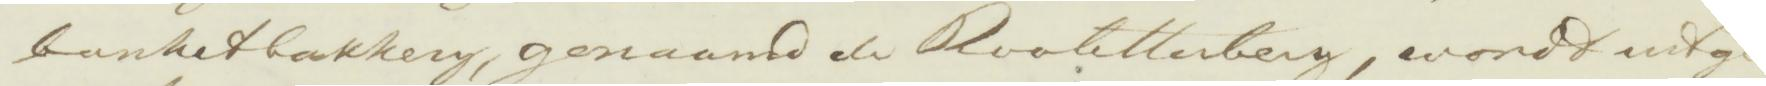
banketbakkery, genaamd de Rooletterberg, wordt uitge
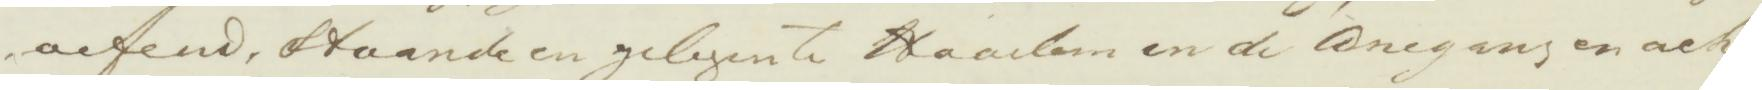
oefend, staande en gelegen te Haarlem in de Anegang en achter
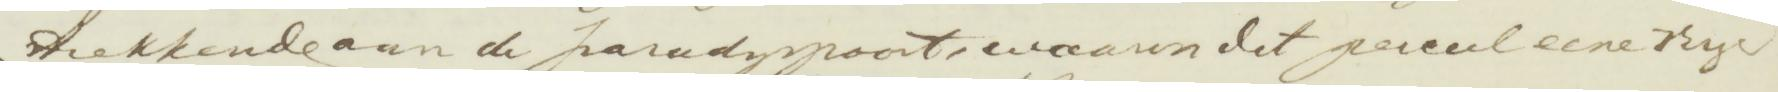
strekkende aan de paradyspoort, waarin dit perceel eene vrye
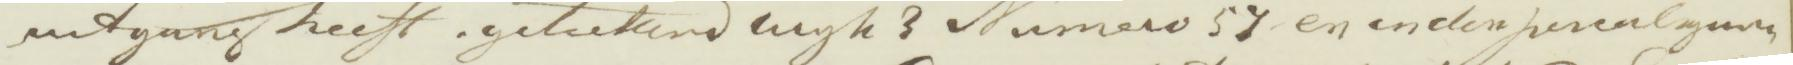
uitgang heeft, geteekend wyk 3 Numero 57 en in den perceel gewy
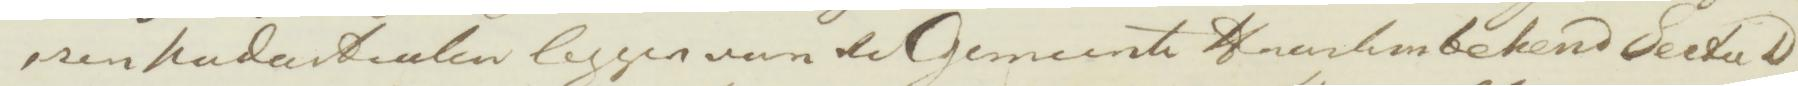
zen kadastralen legger van de Gemeente Haarlem bekend sectie D
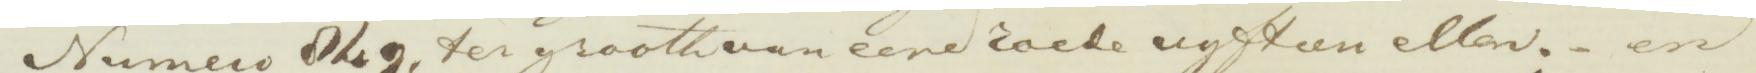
Numero 847, ter grootte van eene roede vyftien ellen; - en
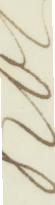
8101
